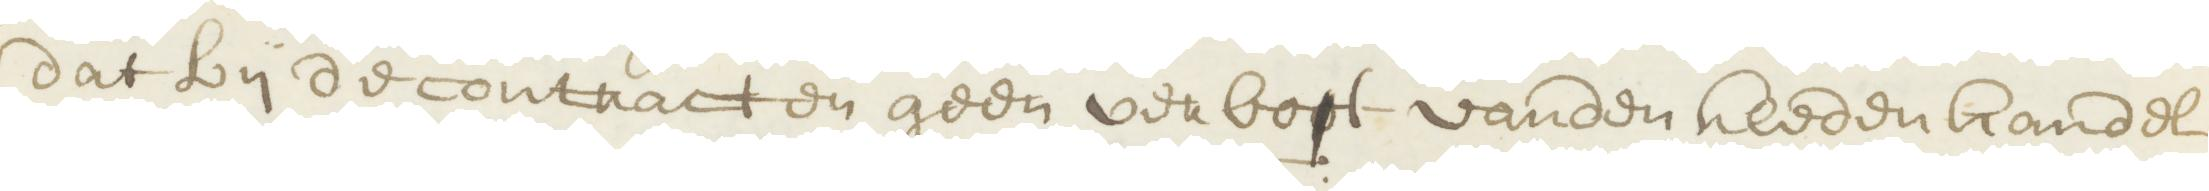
dat bij de contracten geen verboot van den kleden handel
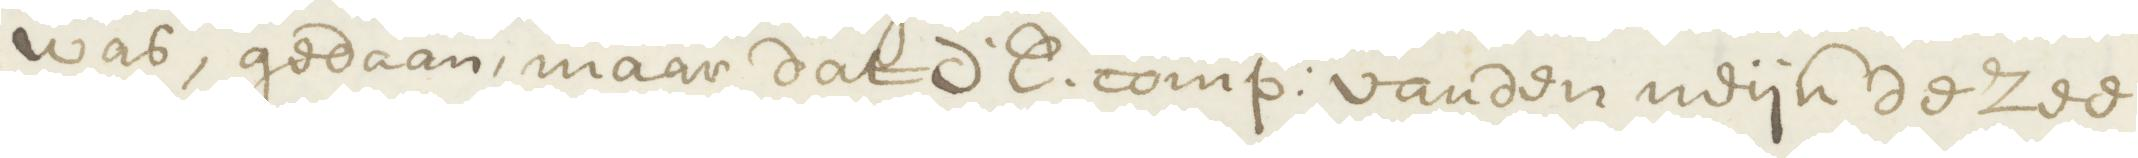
was, gedaan, maar dat d’E. comp: van den neijk de zee
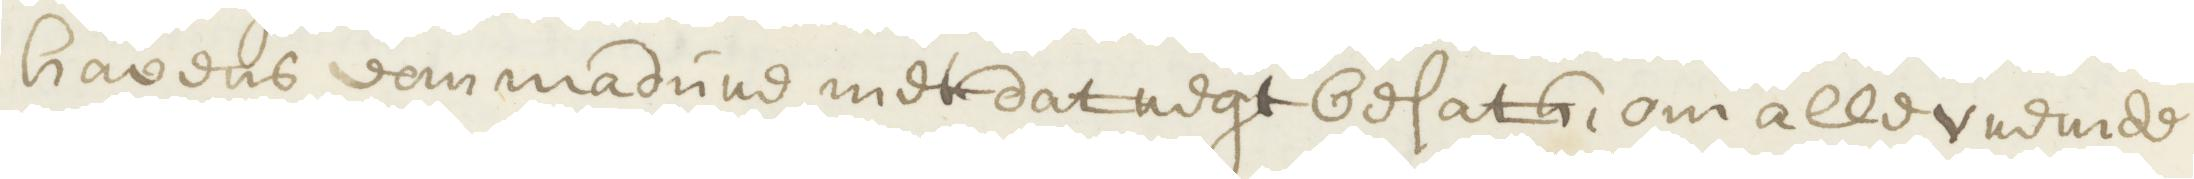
havens van madure niet dat regt besath, om alle vremde
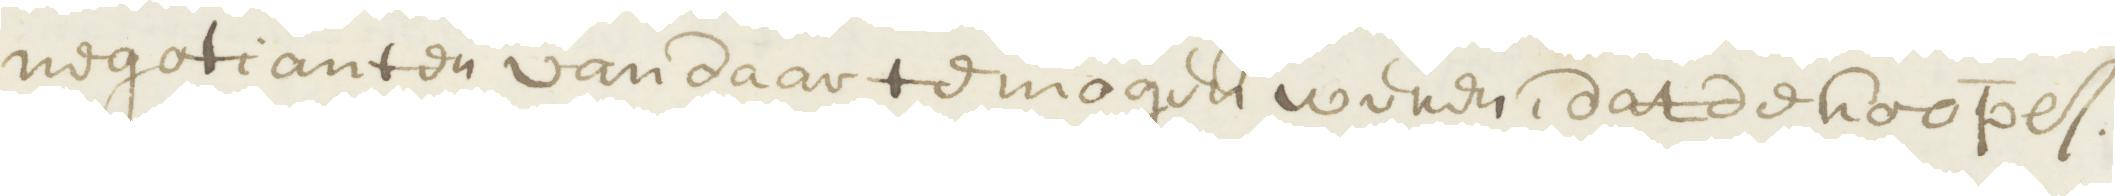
negotianten van daar te mogen weren, dat de koopl
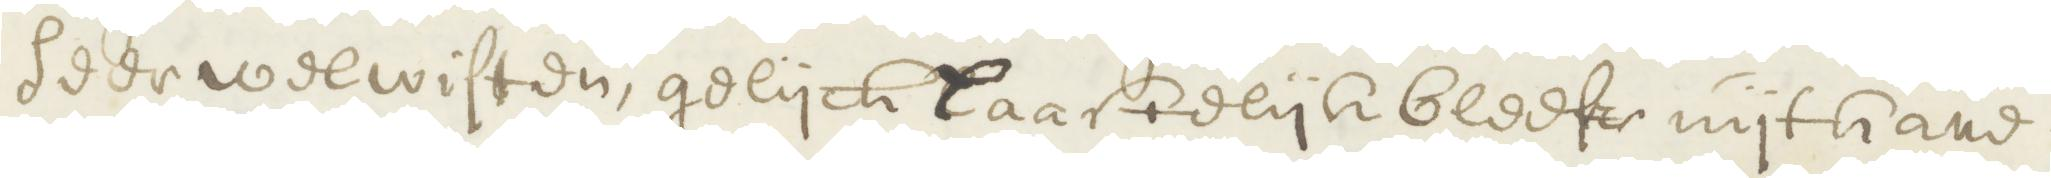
seer wel wisten, gelijck laastelijk bleek uijt hare
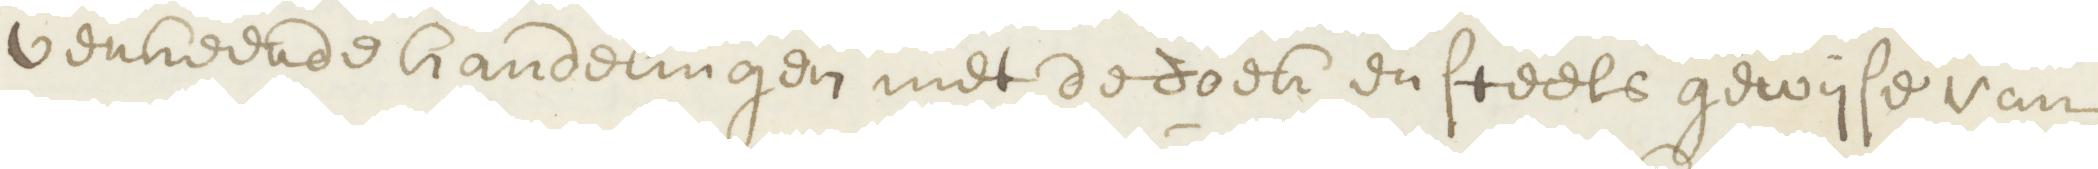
verkeerde handelingen met desoek en steels gewijse van
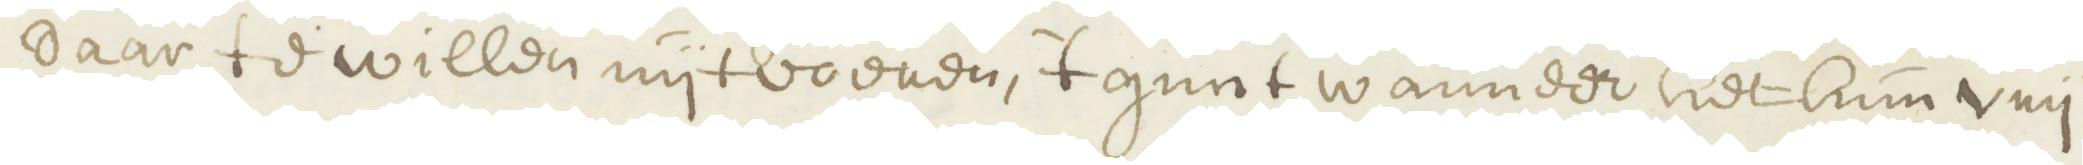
daar te willen uijtvoeren, 't gunt wanneer het hun vrij
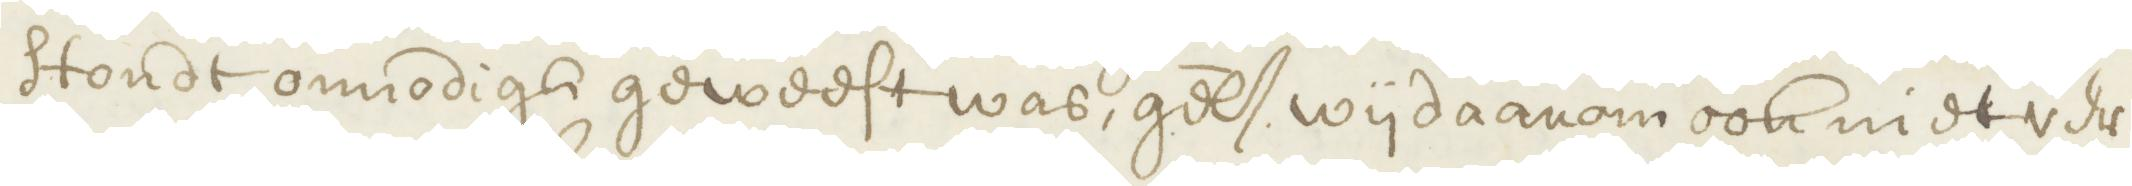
stondt onnodigh geweest was, gelijk wij daarom ook niet ver
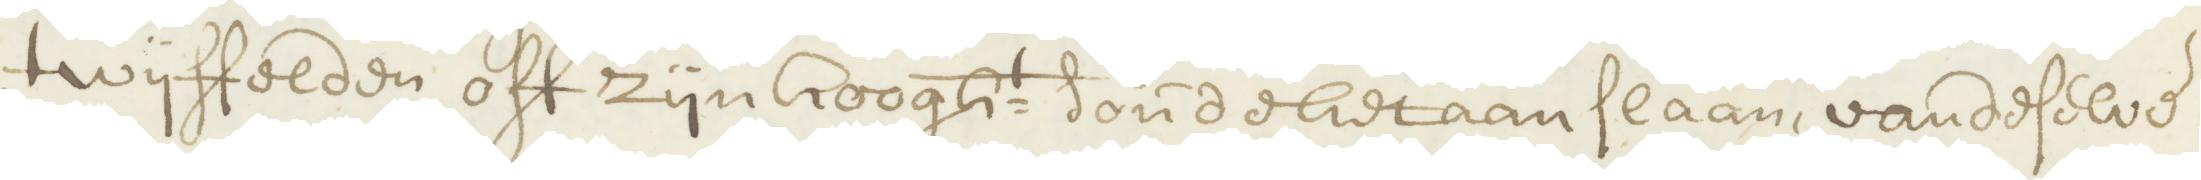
twijffelden off zijn hoogh=t soude het aan slaan, van deselve
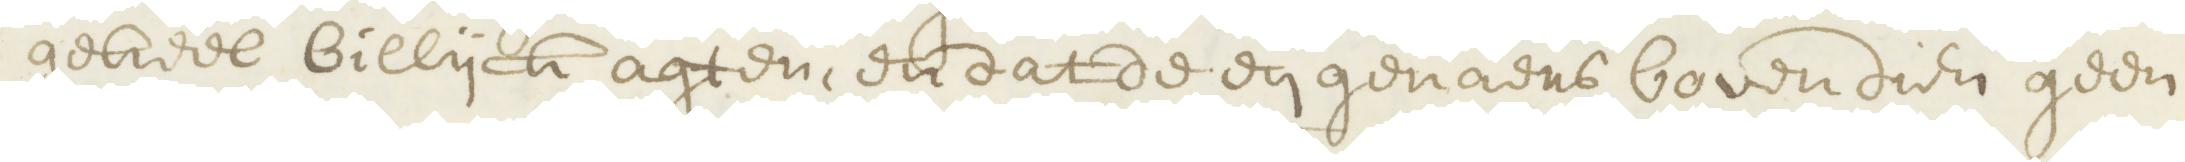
geheel billijck agten, en dat de eijgenaers bovendien geen
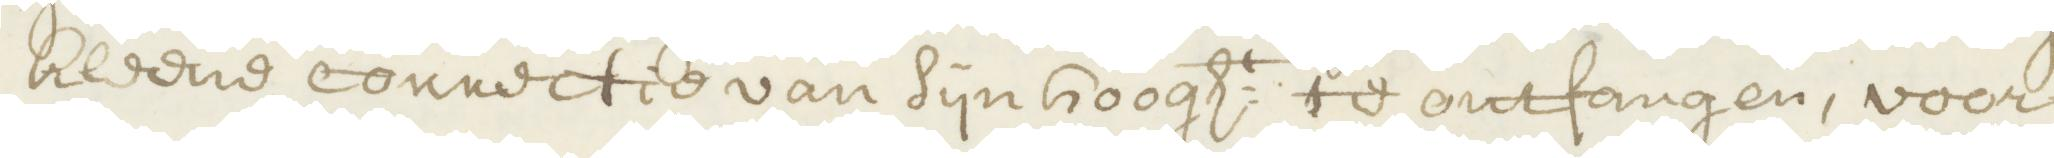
kleene correctie van sijn hoogh:t te ontfangen, voor
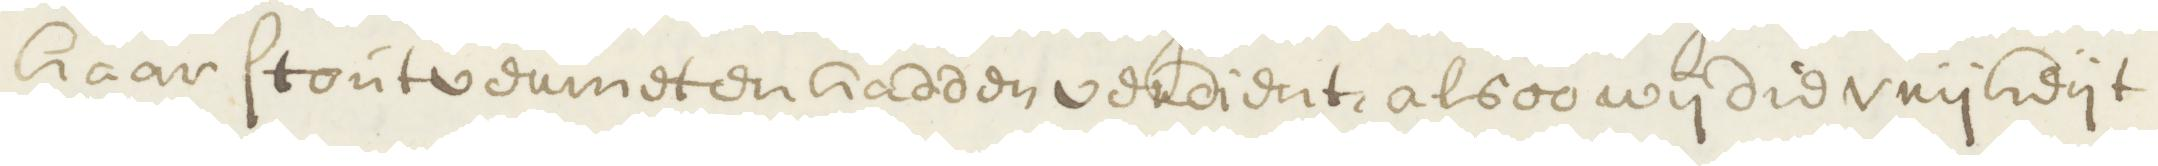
haar stoutvermeten hadden verdient, alsoo wij die vrijheijt
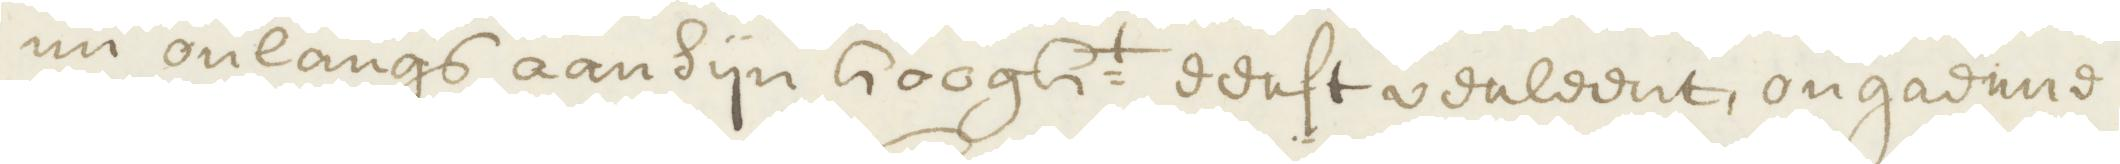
nu onlangs aan sijn hoogh=t eerst verleent, ongaerne
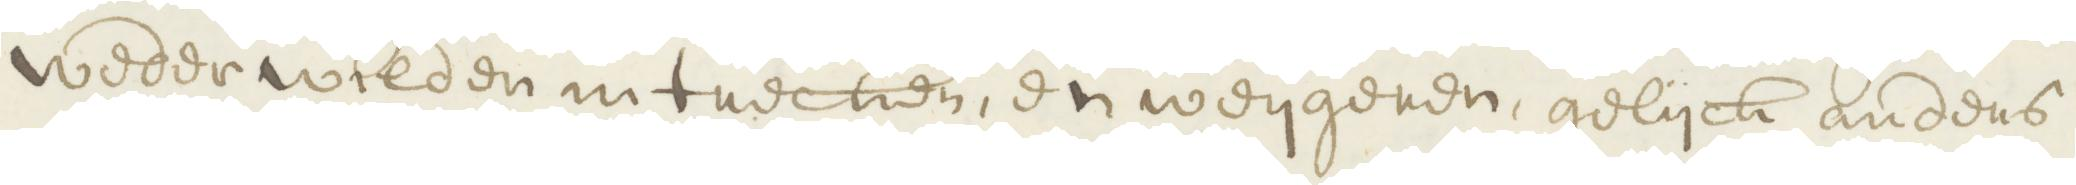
weder wilden in trecken, en weijgeren, gelijck anders
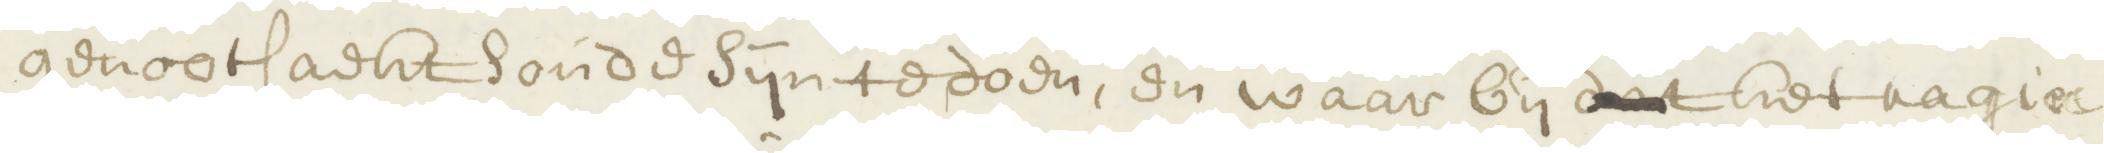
genootsaekt soude sijn te doen, en waar bij dat het ragia
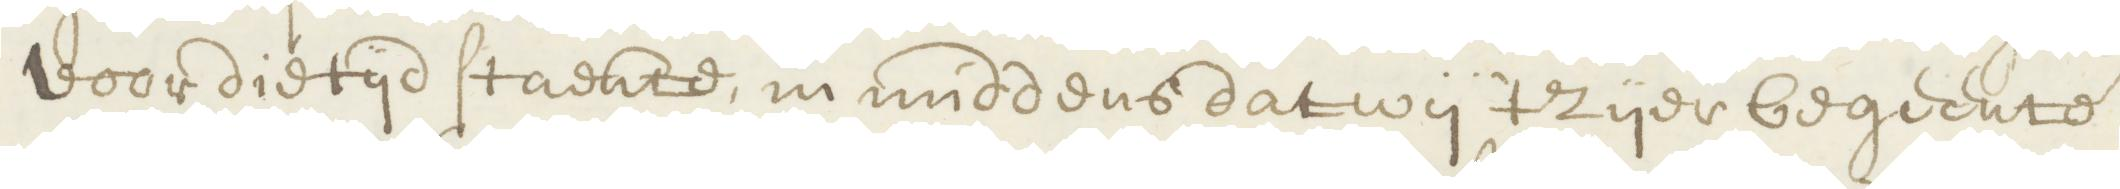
voor die tijd staekte, in middens dat wij ’tzijer begeerte
